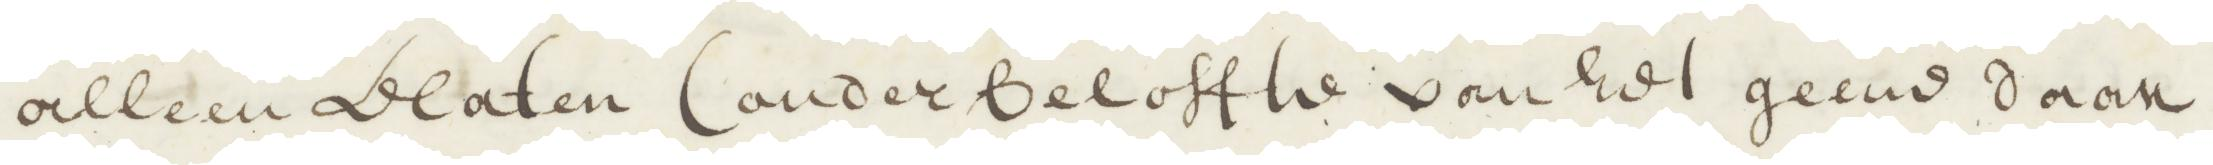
alleen te laten (onder beloffte van het geene daar
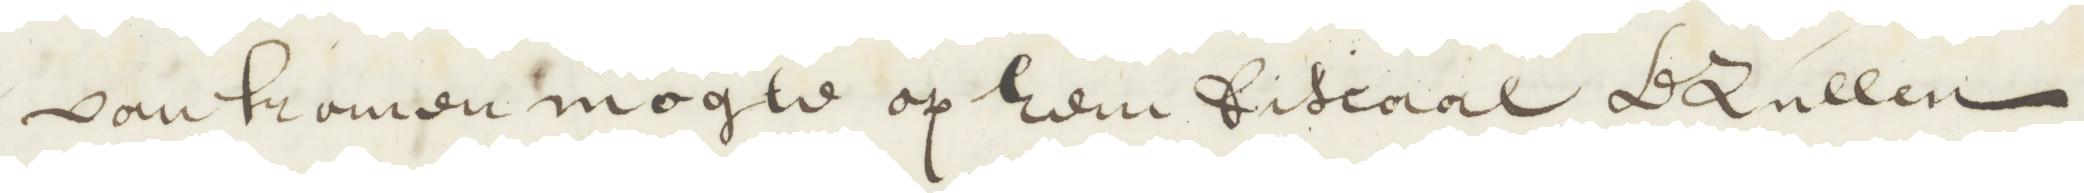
van komen mogte op hem fiscaal te zullen
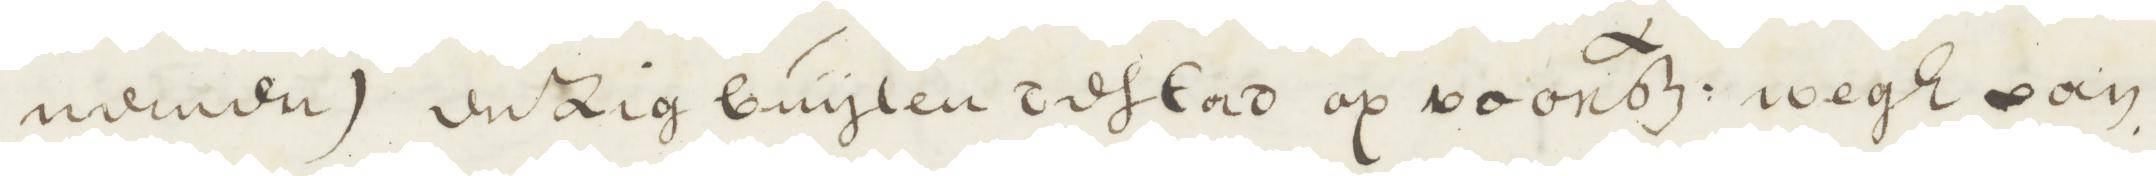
nemen) en zig buijten de stad op voorsz: wegh van
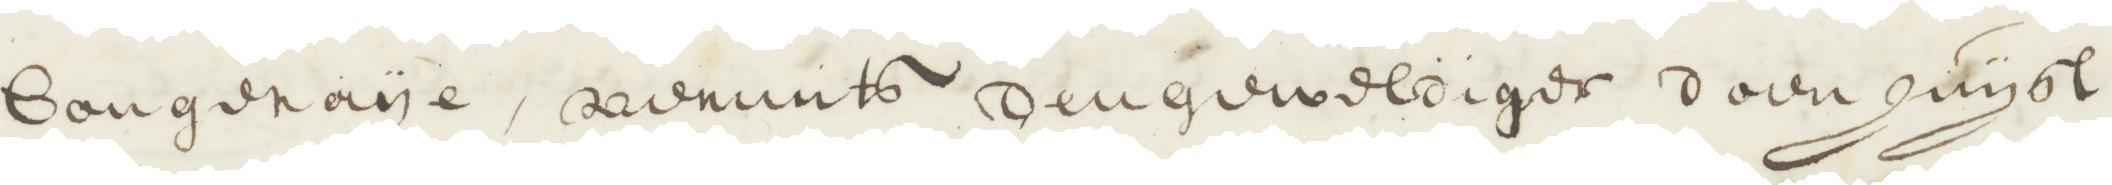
bangeraije, vermits den geweldiger doen juijst
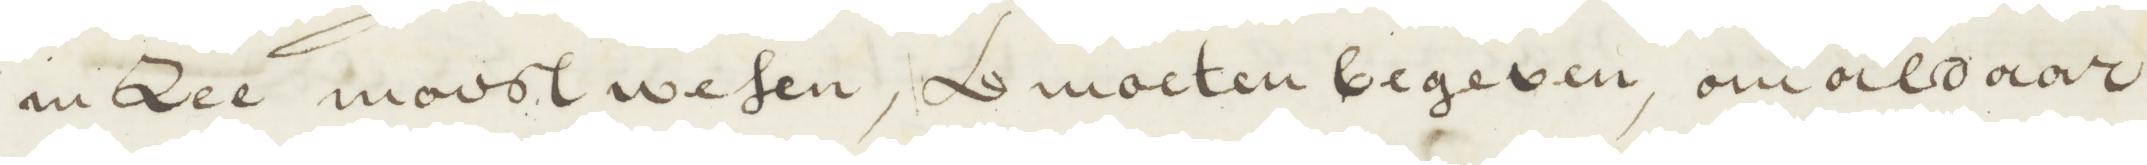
in zee moest wesen, te moeten begeven, om al daar
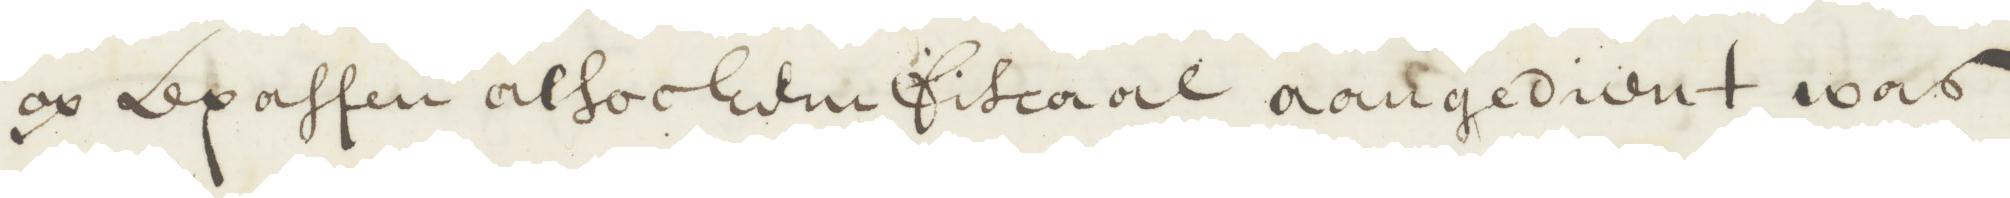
op te passen alsoo hem fiscaal aangedient was
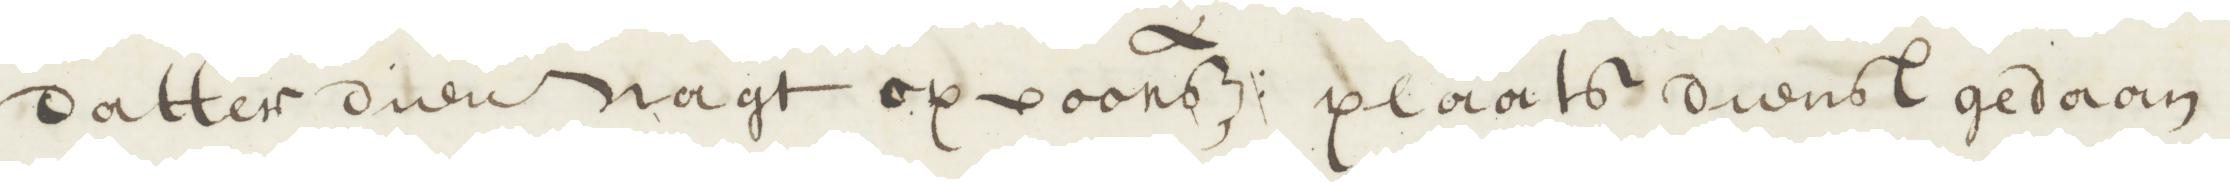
datter dien nagt op voorsz: plaats dienst gedaan
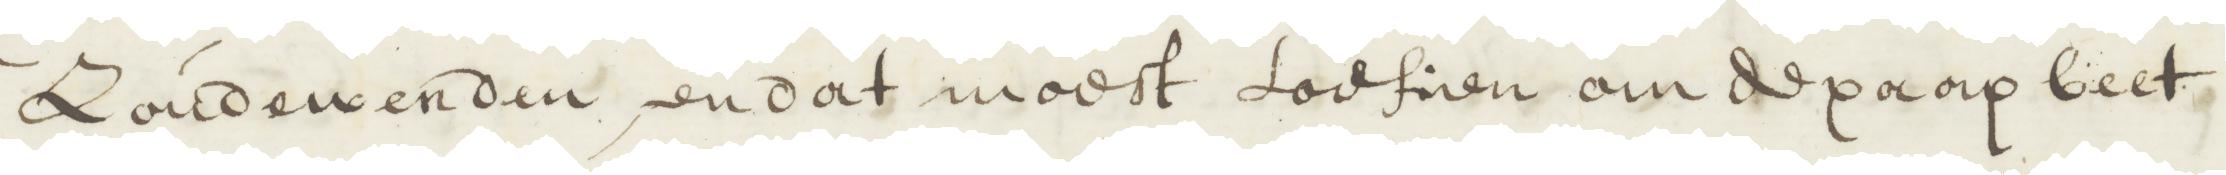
zoude werden, en dat moest toesien om de paap beet
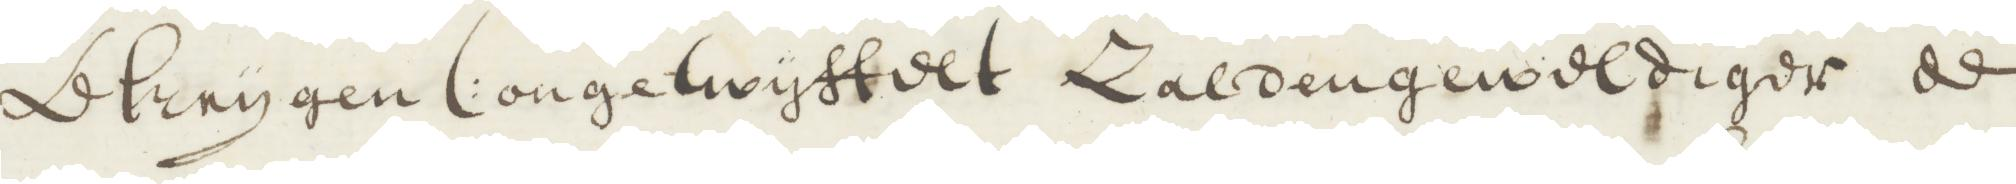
te krijgen (:ongetwijffelt zal den geweldiger de
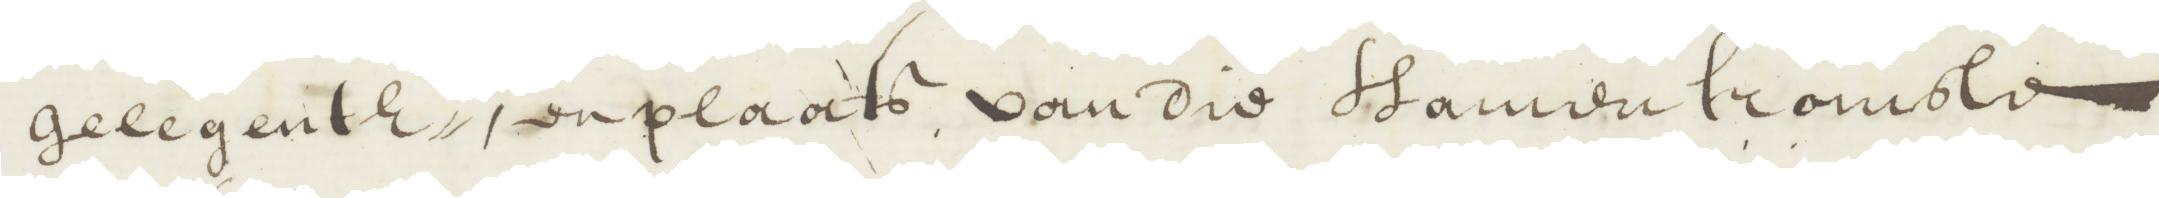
gelegenth„t, en plaats van die tsamen komste
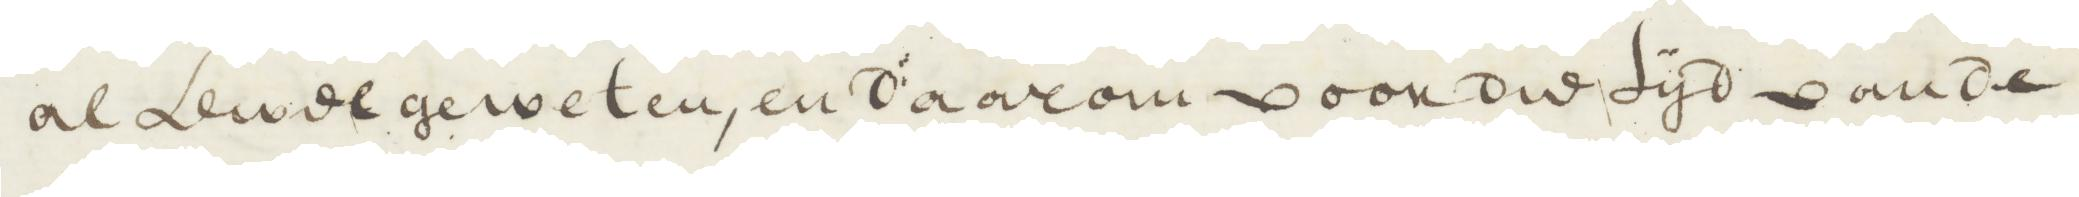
al tewel geweten, en daarom voor die tijd van de
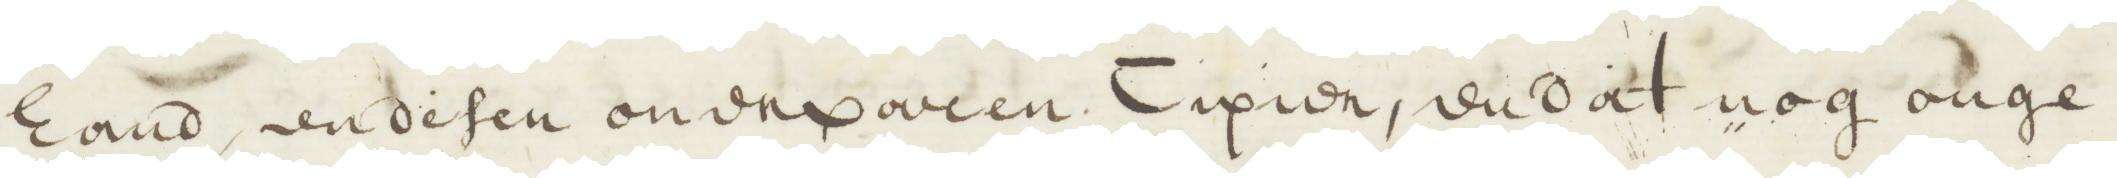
hand, en desen onervaren Cipier, en dat nog onge
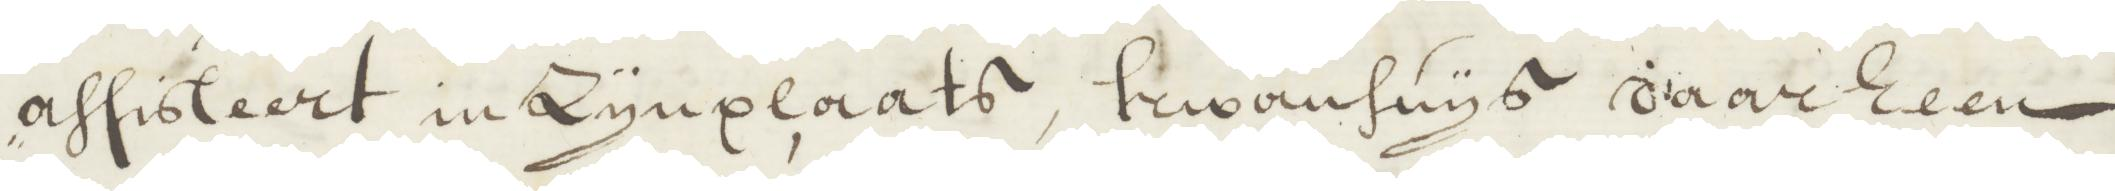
„assisteert in zijn plaats, kwansuijs daar heen
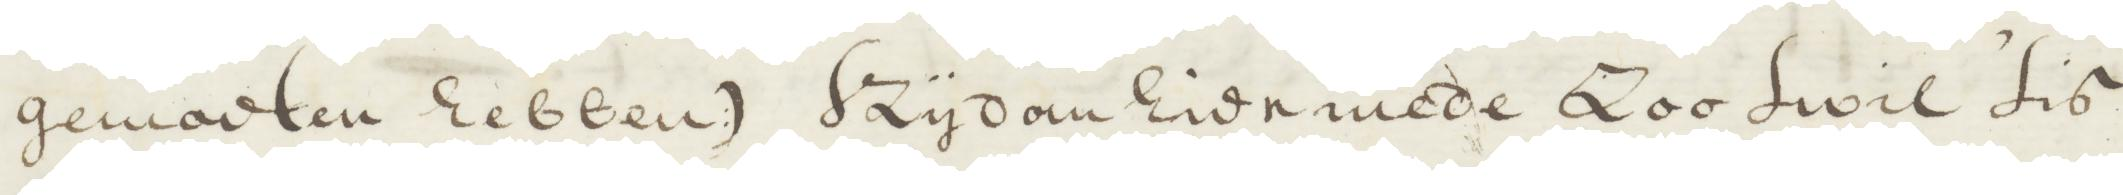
gemoeten hebben:) 'tzij dan hier mede zoo twil 'tis
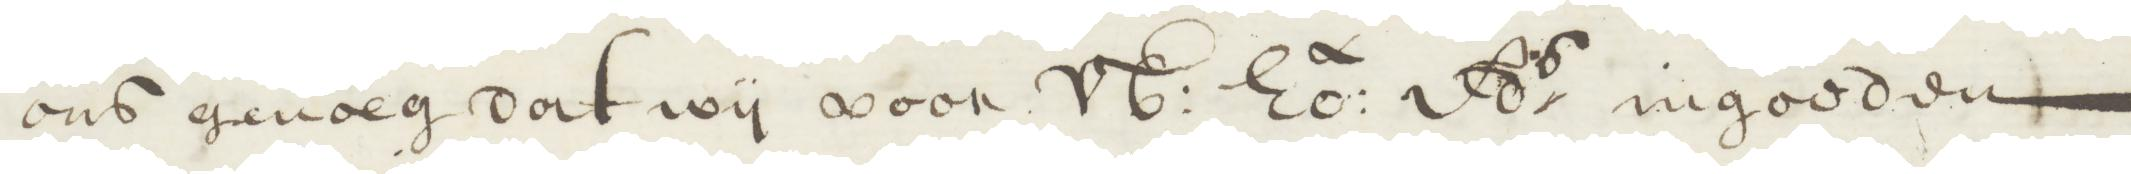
ons genoeg dat wij voor VE: ho: Ed„s in goeden
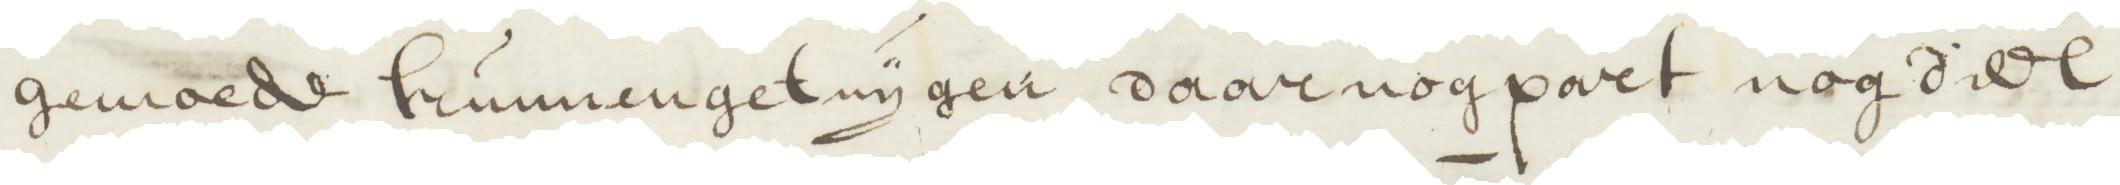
gemoede kunnen getuijgen, daar nog part nog deel
